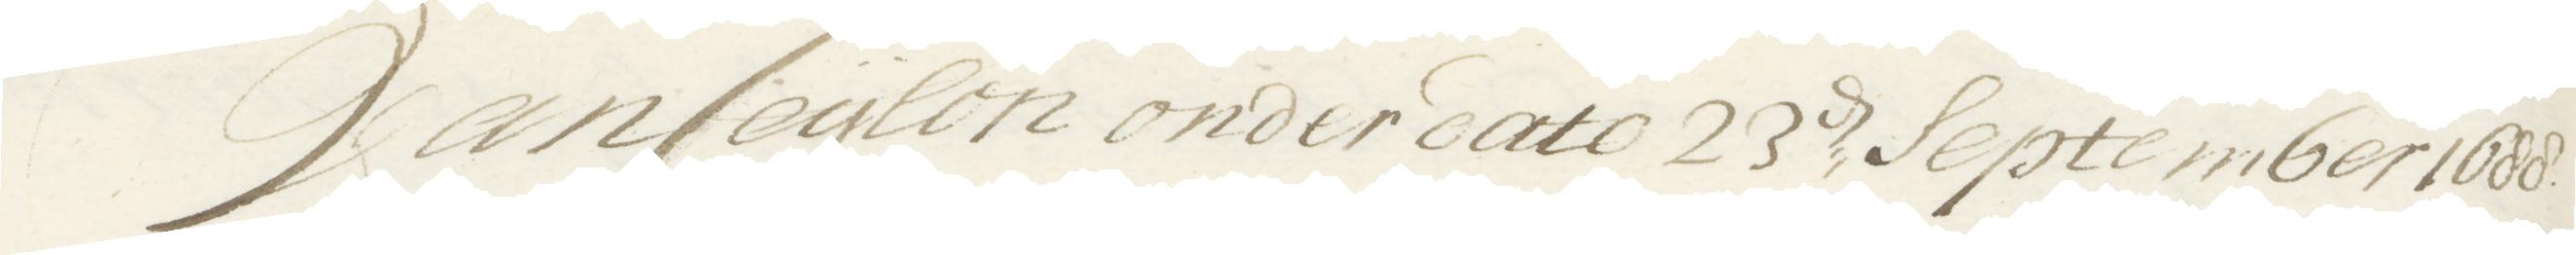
Van Ceijlon onder dato 23„en september 1688.
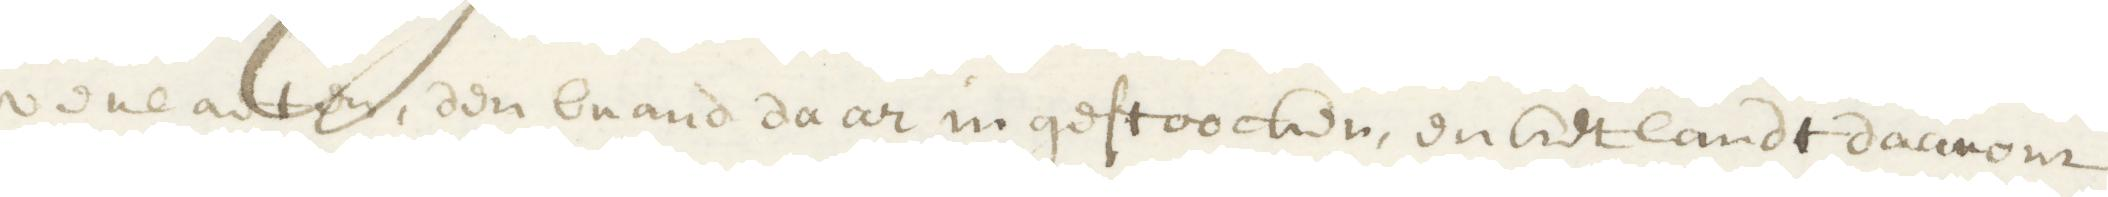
verlaeten, den brand daar in gestoocken, en het landt daarom
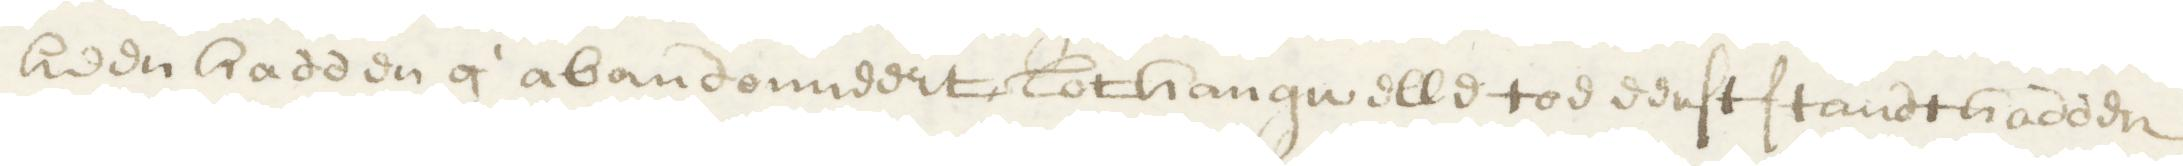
heen hadden g’ abandonneert, tot hangwelle toe eerst standt hadden
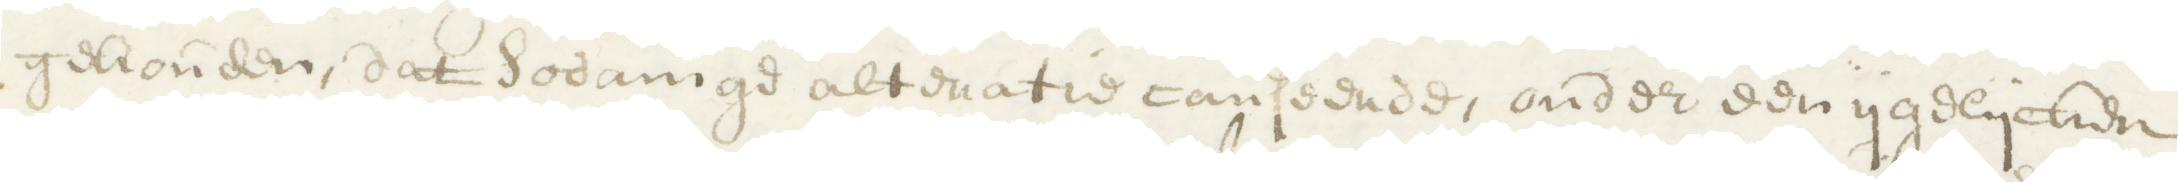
gehouden, dat sodanige alteratie causeerde, onder een ijgelijcken
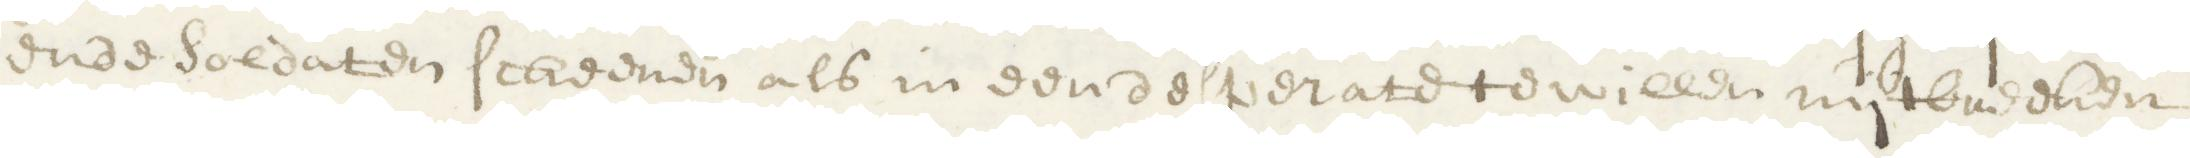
ende soldaten scheenen als in een desperate te willen uijtbreeken
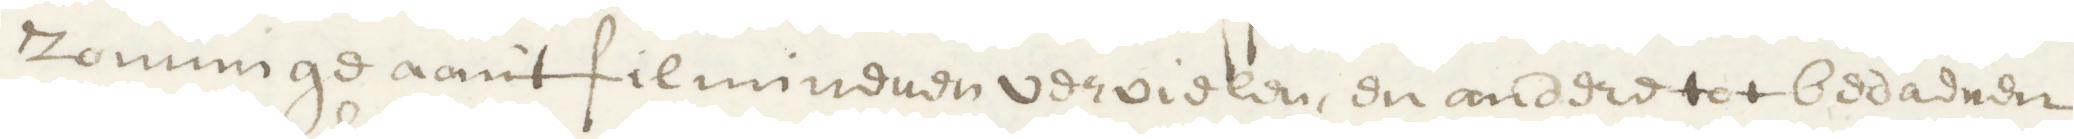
zommige aan’t filmineren vervielen, en andere tot bedaeren
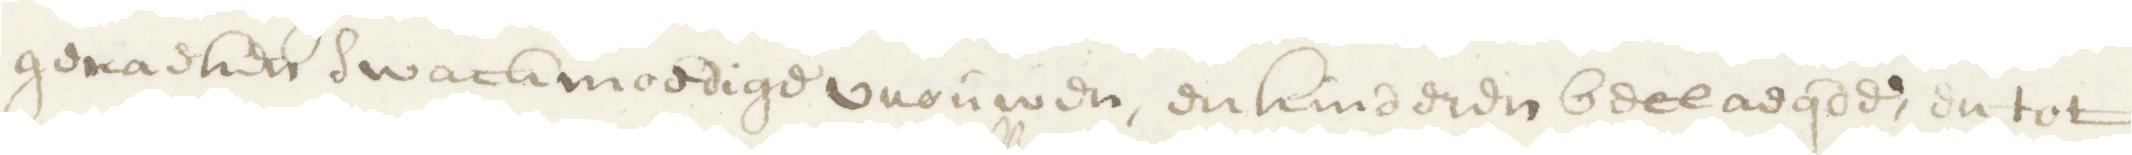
geraeken swackmoedige vrouwen, en kinderen beclaegde, en tot
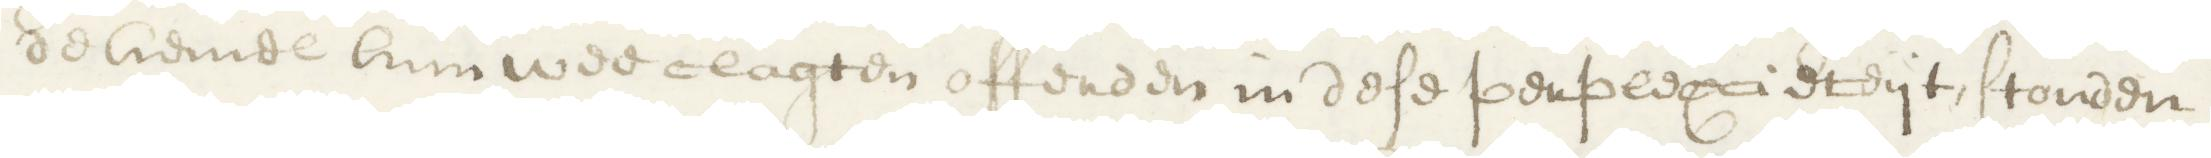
de kemdl hun wee clagten offerden in dese perplexcieteijt, stonden
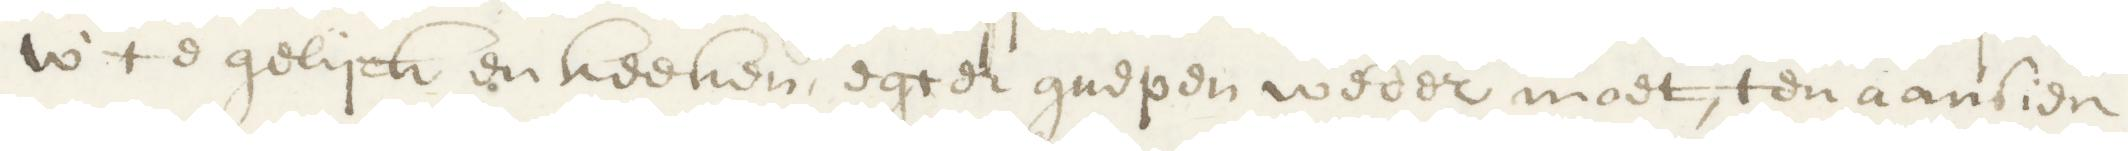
w' te gelijck en keeken, egter grepen weder moet, ten aansien
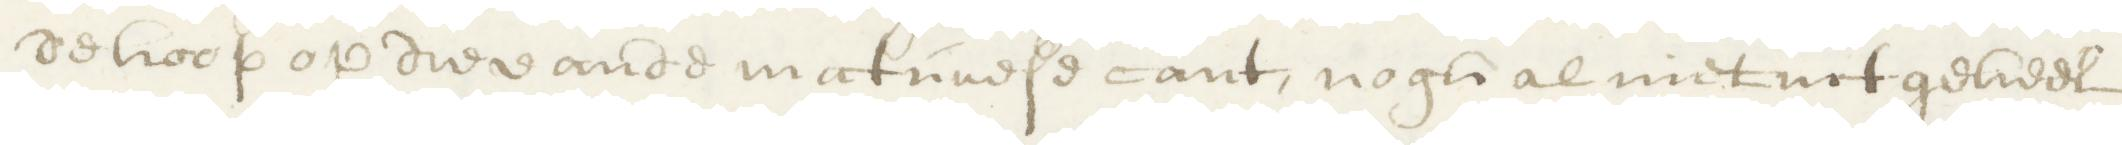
de hoop op die vande maturese cant, nogh al niet in't geheel
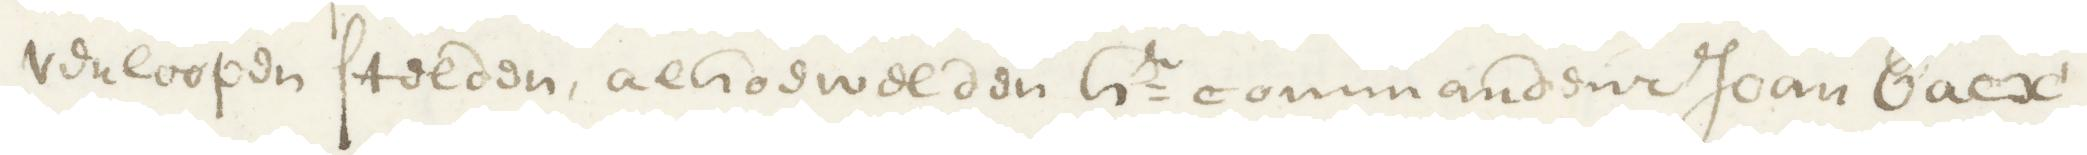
verloopen stelden, alhoewel den H=r commandeur Joan bacx
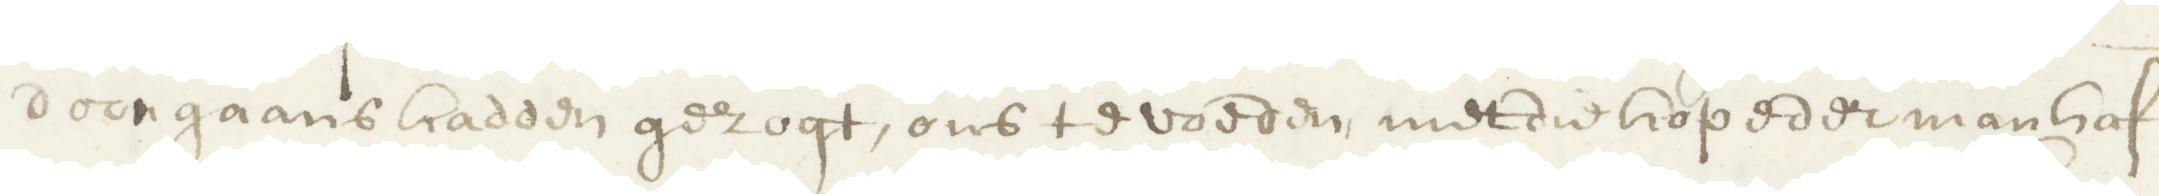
door gaans hadden gezogt, ons te voeden, met die hopeder manhaf
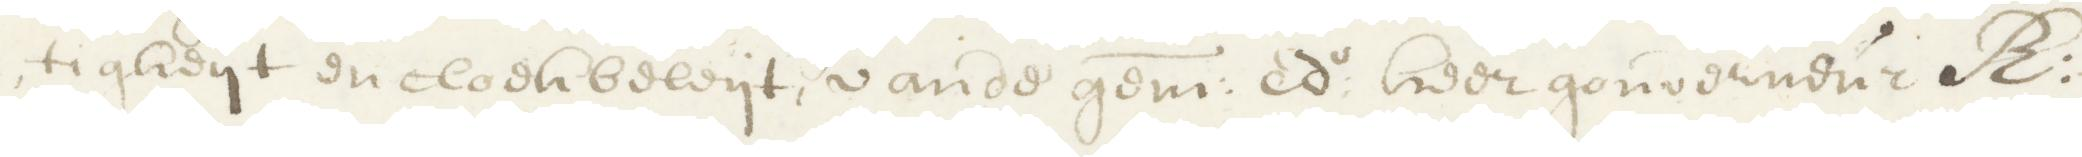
„tigheijt en cloekbeleijt, van de gem: Ed:e heer gouverneur R:
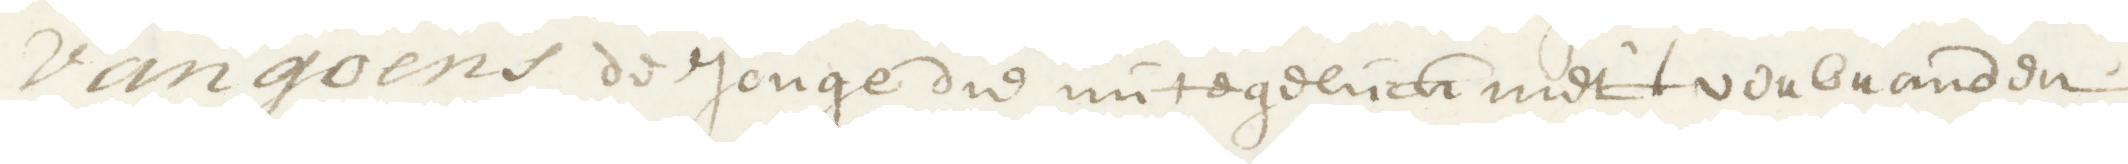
Van goens de Jonge die nu tegelijck met 't verbranden
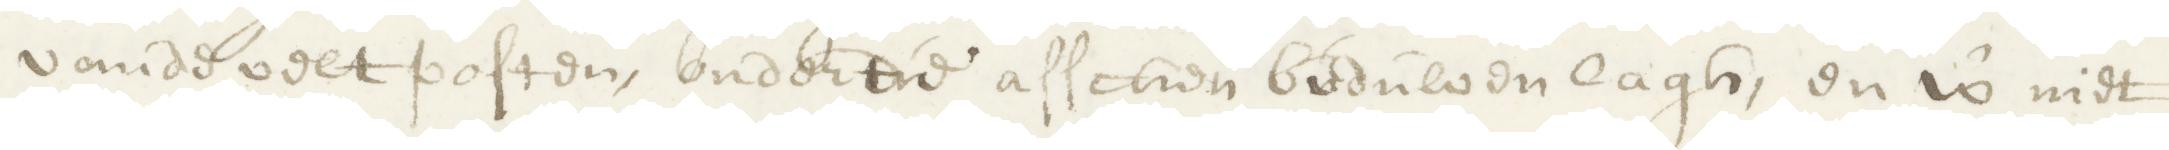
van de veltposten, onder de asschen bedulven lagh, en w' niet
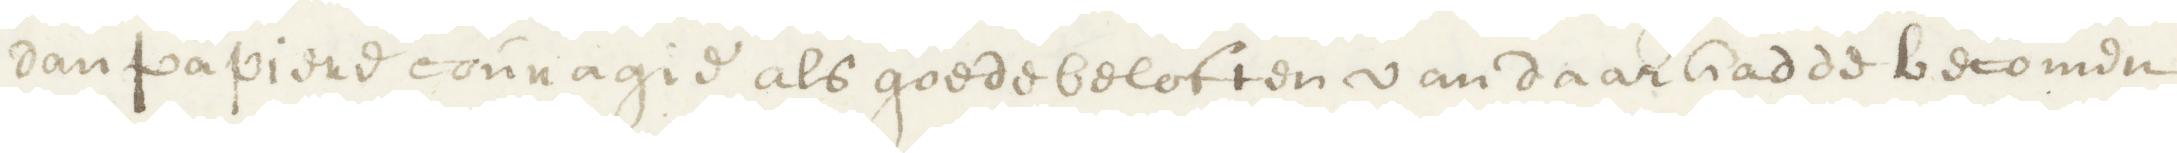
dan papiere couragie als goede beloften van daar hadde becomen
